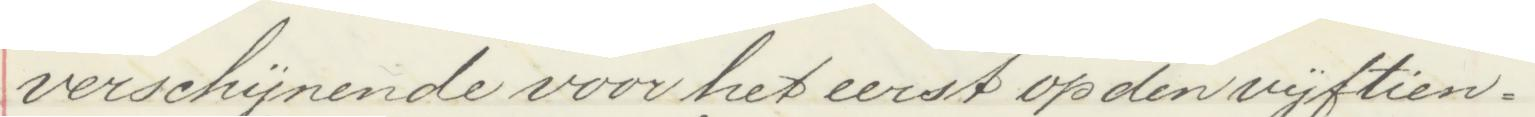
verschijnende voor het eerst op den vijftien-
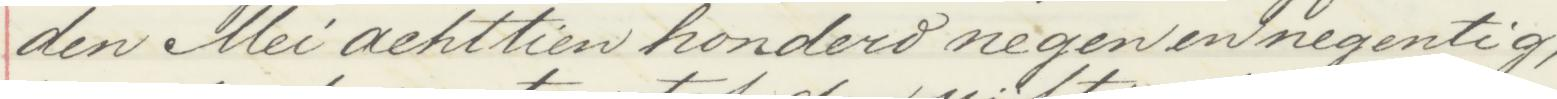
den Mei achttien honderd negen en negentig,
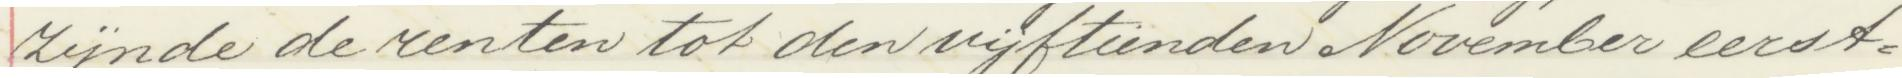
zijnde de renten tot den vijftienden November eerst=
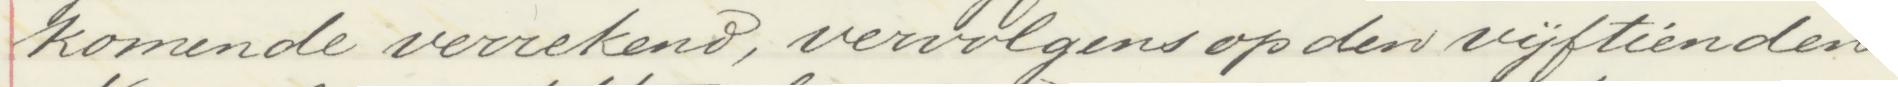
komende verrekend, vervolgens op den vijftienden
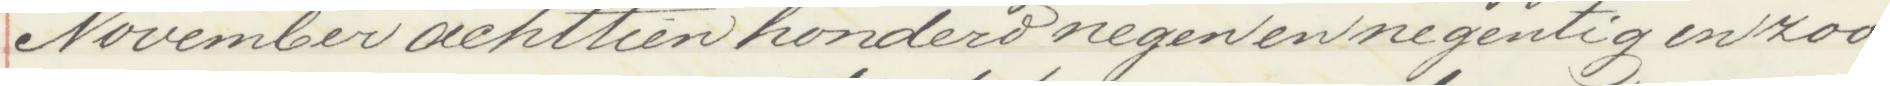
November achttien honderd negen en negentig in zoo
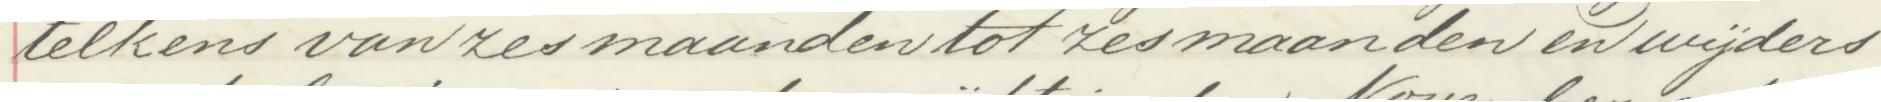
telkens van zes maanden tot zes maanden en wijders
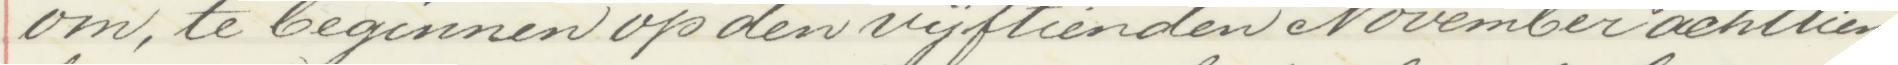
om, te beginnen op den vijftienden November achttien
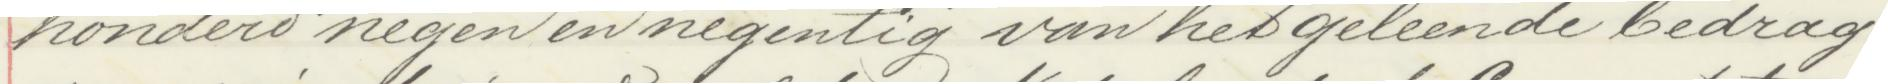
honderd negen en negentig van het geleende bedrag
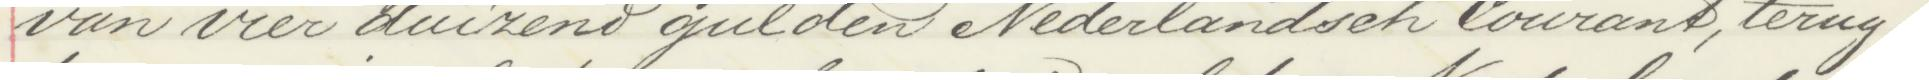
van vier duizend gulden Nederlandsch Courant, terug=
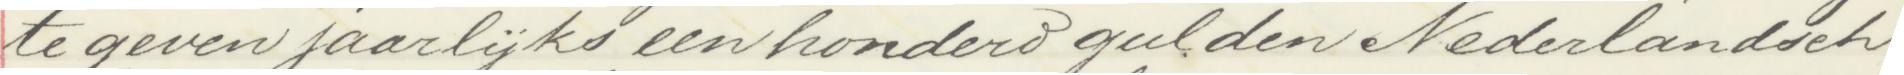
tegeven jaarlijks een honderd gulden Nederlandsch
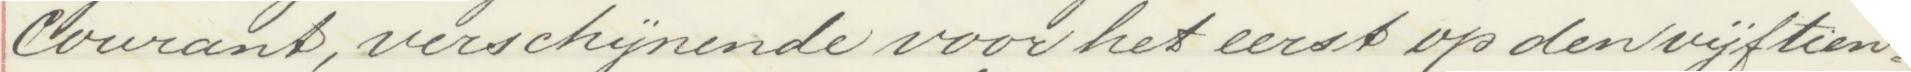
Courant, verschijnende voor het eerst op den vijftien„
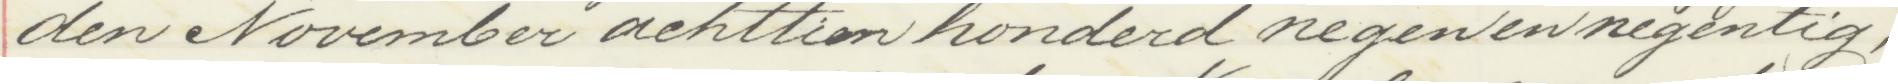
den November achttien honderd negen en negentig,
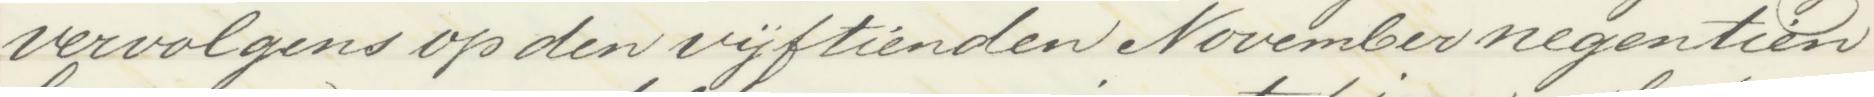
vervolgens op den vijftienden November negentien
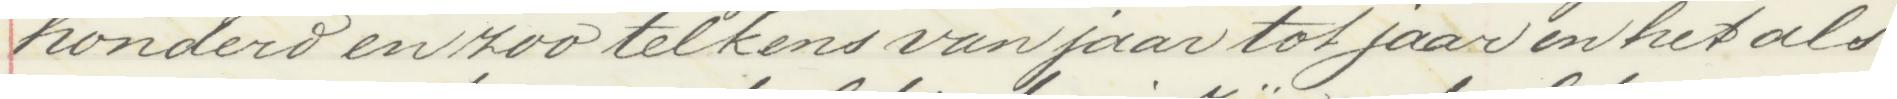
honderd en zoo telkens van jaar tot jaar in het als
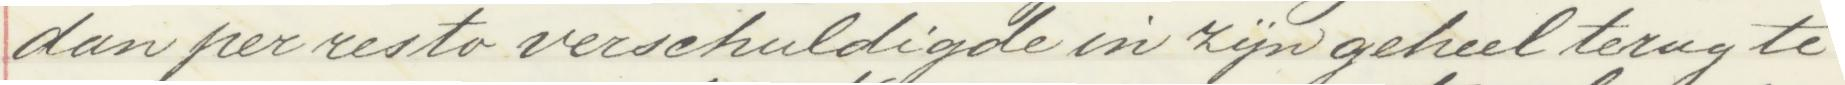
dan per resto verschuldigde in zijn geheel terug te
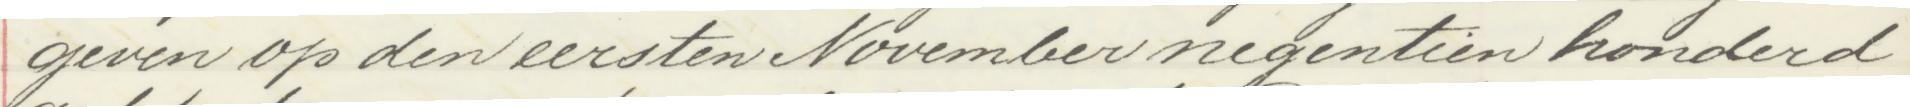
geven op den eersten November negentien honderd
